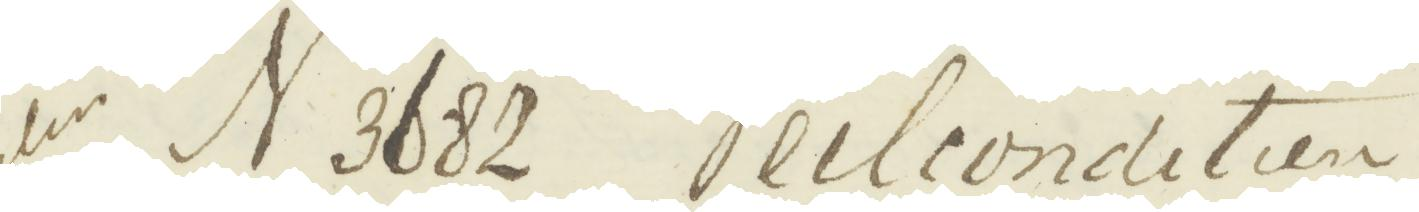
N:o 3682 Veilconditien
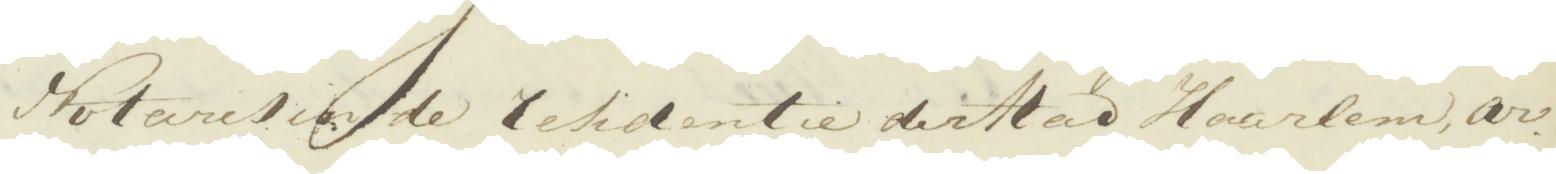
Notaris in de residentie der stad Haarlem, ar
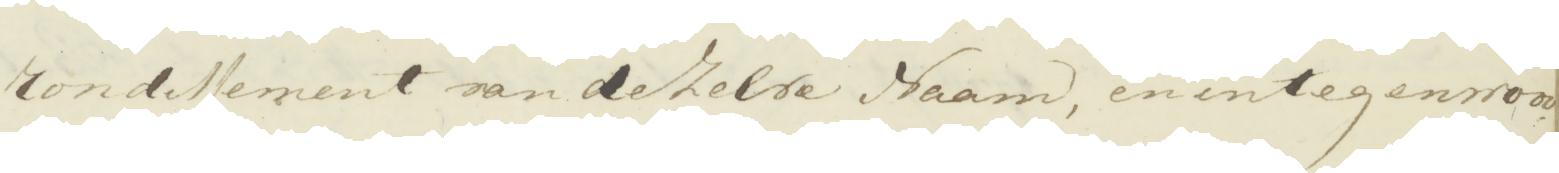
rondissement van deZelve Naam, en in tegenwoor
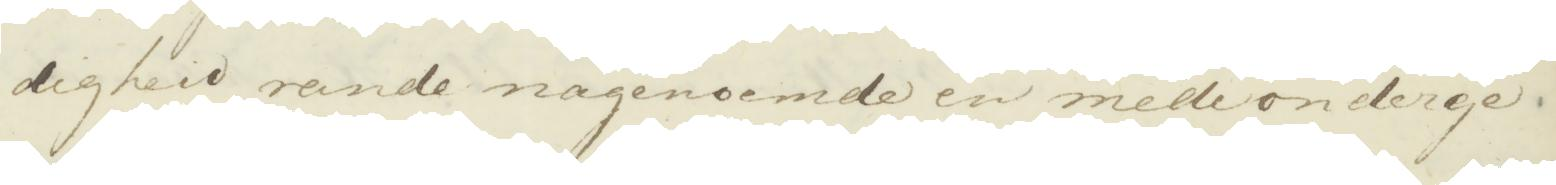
digheit vande nagenoemde en mede onderge
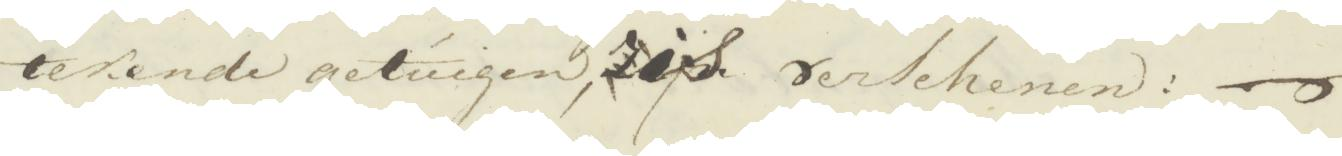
tekende getuigen, is verschenen:
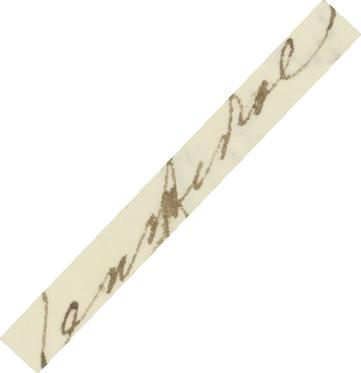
Eerenschal
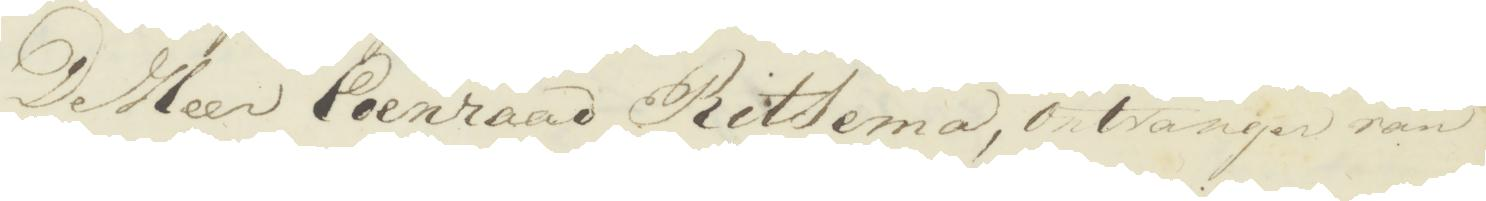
De Heer Coeraad Ritsema, ontvanger van
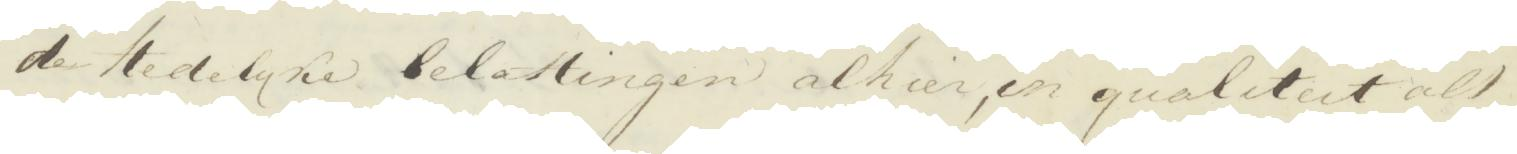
de stedelyke belastingen alhier, in qualiteit als
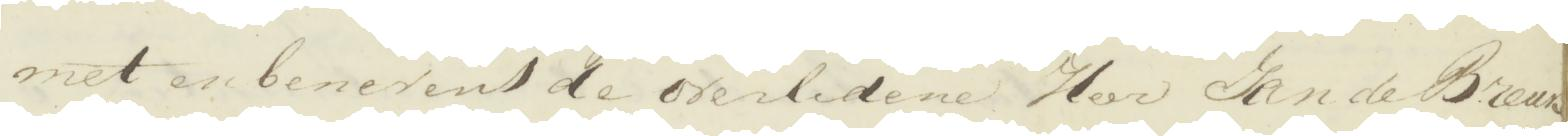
met en benevens de overledene Heer Jan de Breuk
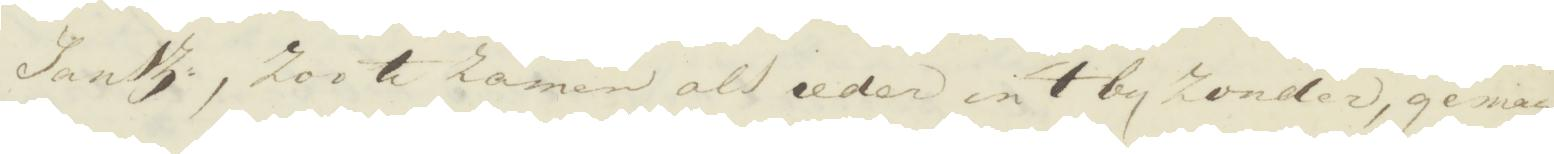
Jantz„n Zoo te zamen als ieder in ’t by zonder, gemag
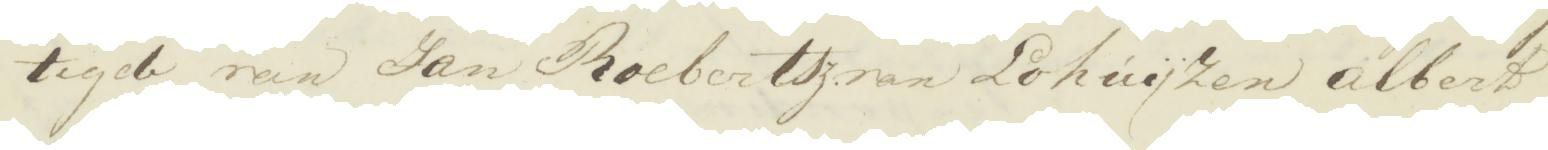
tigde van Jan Roebertsz. van Lohuijzen Albert
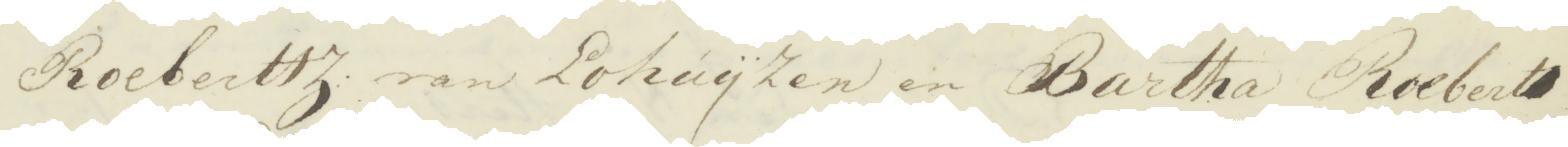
Roebertsz. van Lohuijzen en Bartha Roeberts
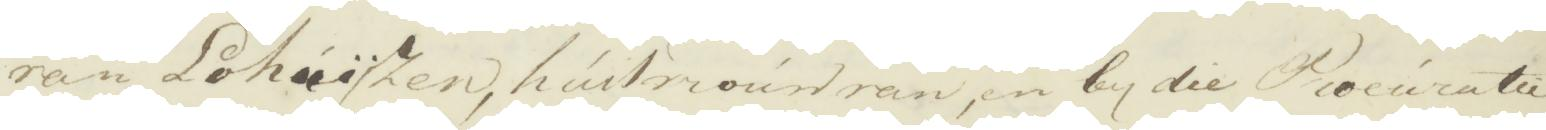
van Lohuijzen, huisvrouw van, en by die Procuratie
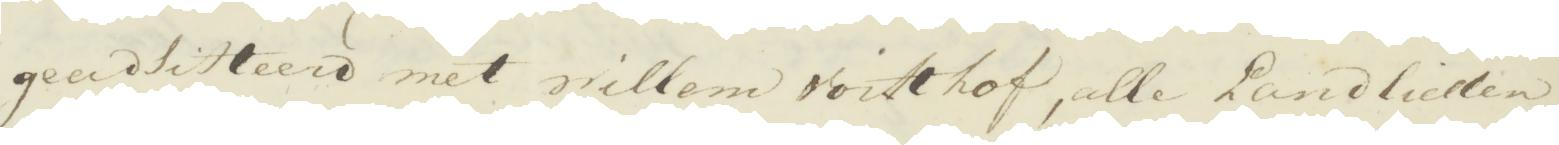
geadsisteerd met willem vorsthof, alle Landlieden,
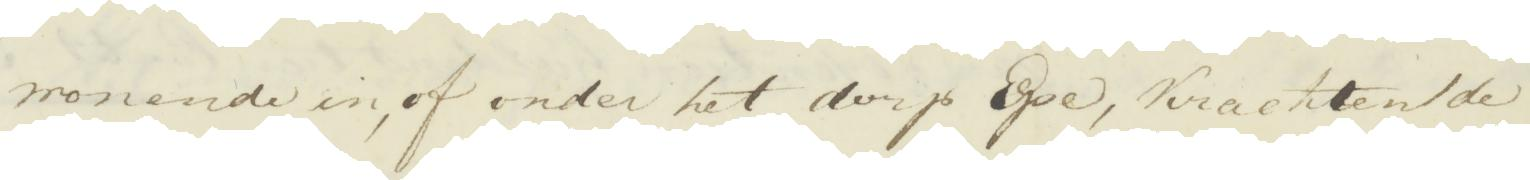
wonende in, op onder het dorp Epe, krachtens de
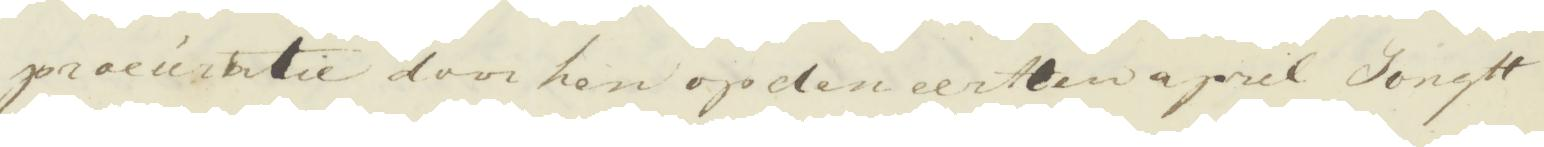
procuratie door hen op den eersten april Jongst
